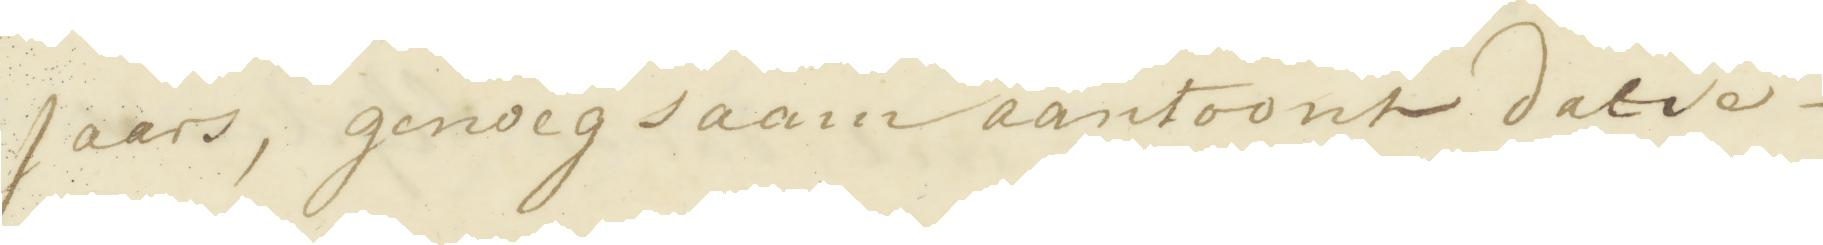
Jaars, genoeg saam aantoont dat se
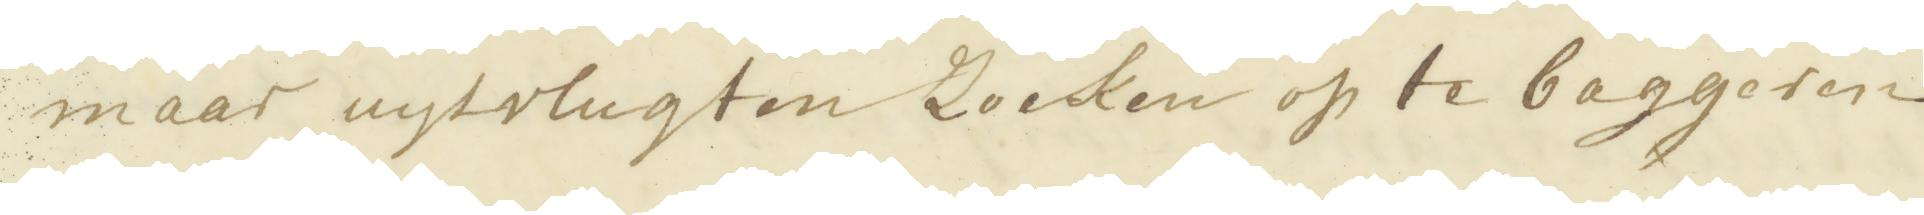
maar uytvlugten Zoeken op te baggeren
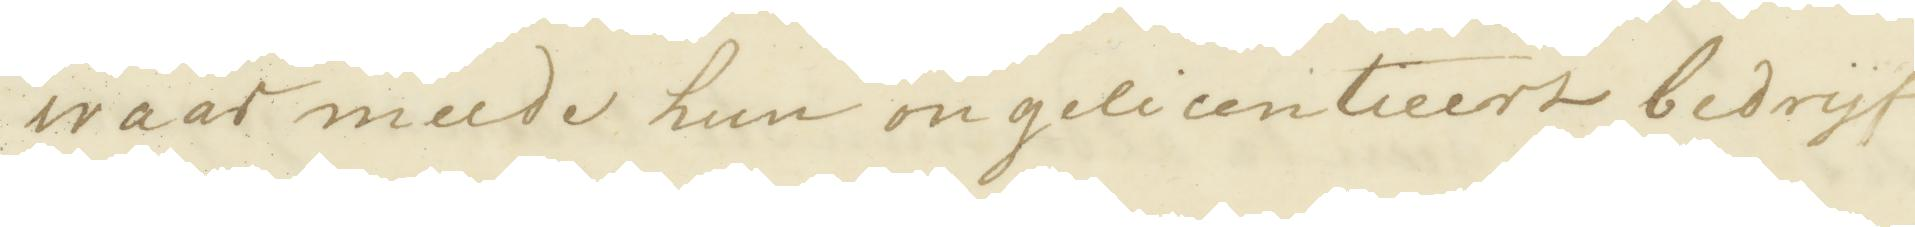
waar meede hun ongelicentieert bedrijf
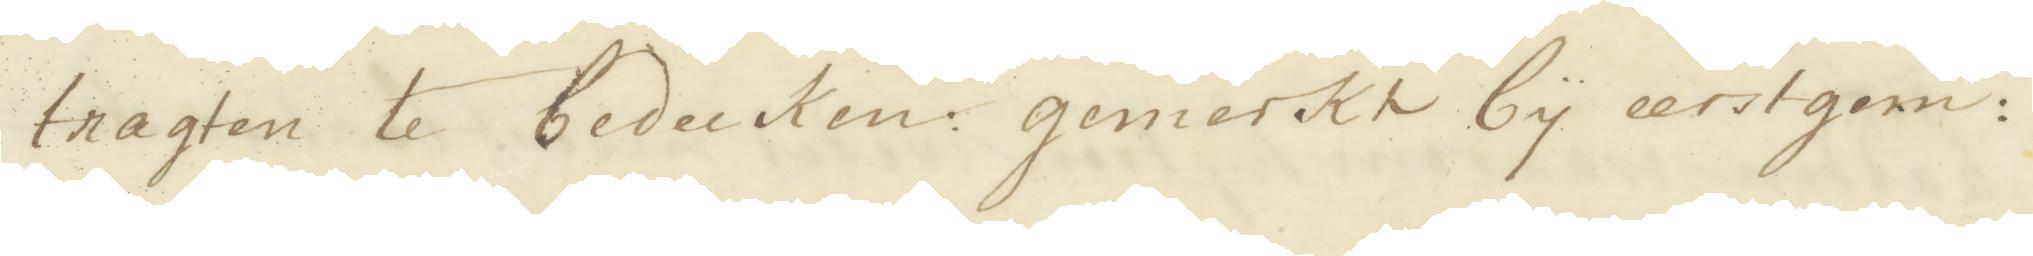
tragten te bedecken: gemerkt bij eerstgem:
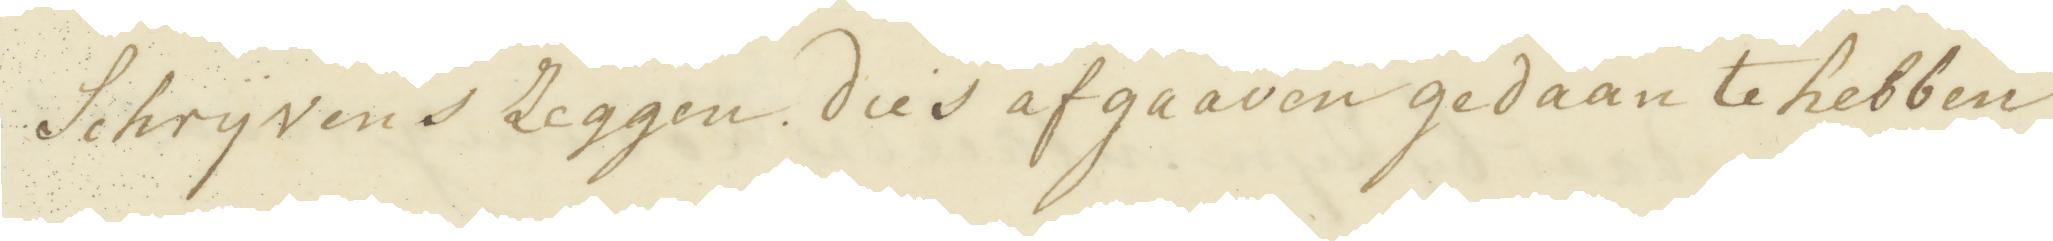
Schrijvens Zeggen dies afgaaven gedaan te hebben
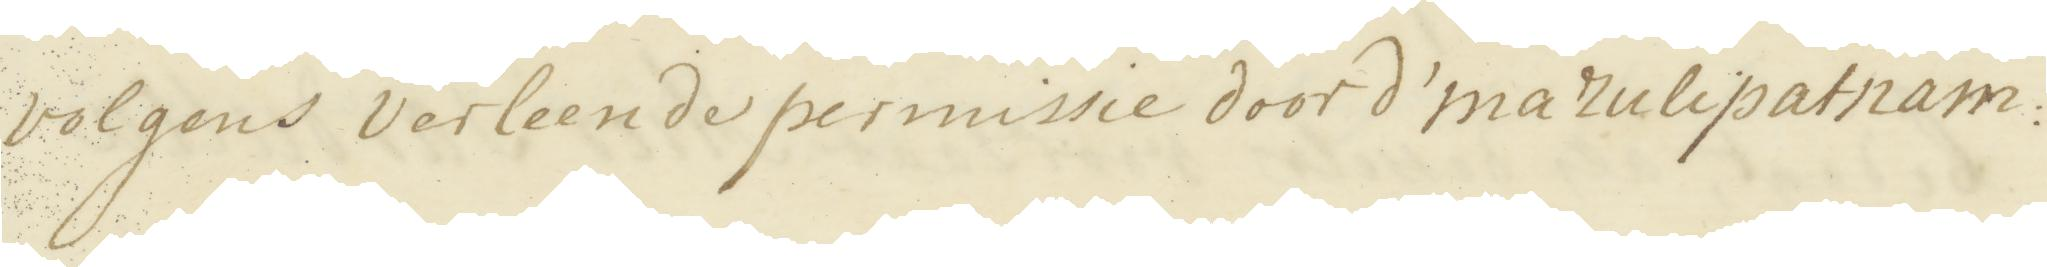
volgens verleende permissie door d’ mazulipatnam:e
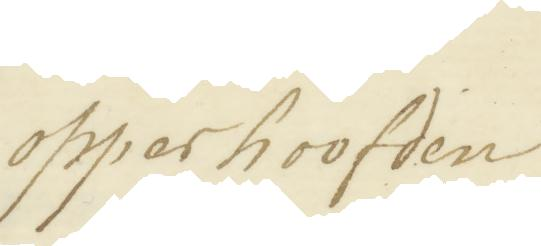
opperhoofden
